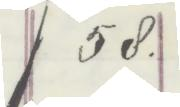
ƒ 58.
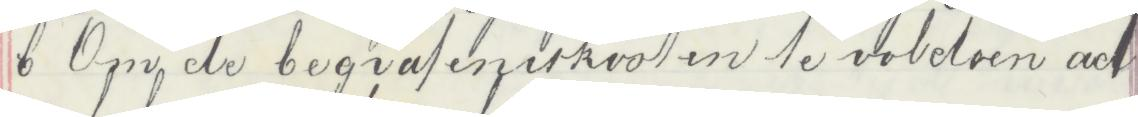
b Om de begrafeniskosten te voldoen ad
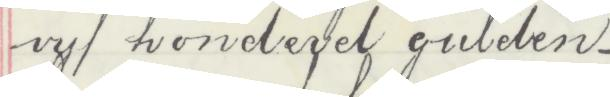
vyf honderd gulden
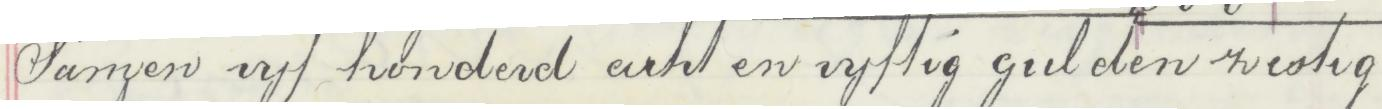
Samen vyf honderd acht en vyftig gulden zestig
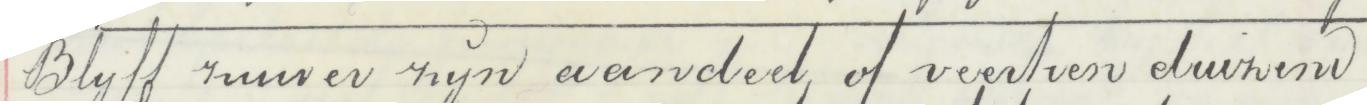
Blyft zuiver zijn aandeel of veertien duizend
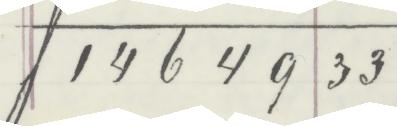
ƒ14619 33
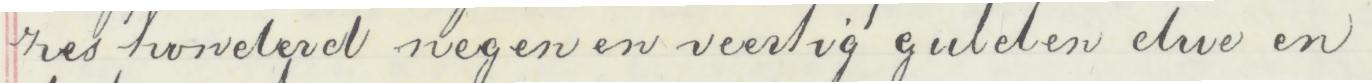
zes honderd negen en veertig gulden drie en
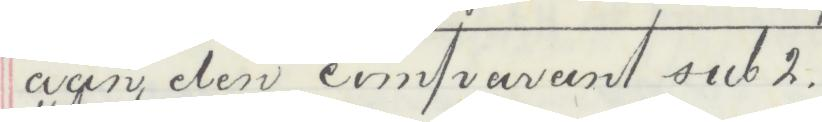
aan den compparant sub 2
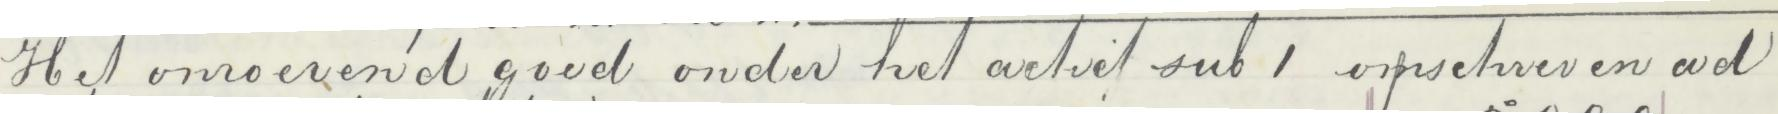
Het onroerend goed onder het actief sub 1 omschreven ad
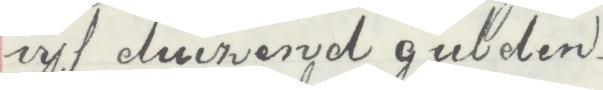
vyf duizend gulden
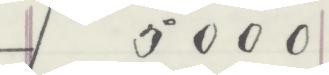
ƒ 5000
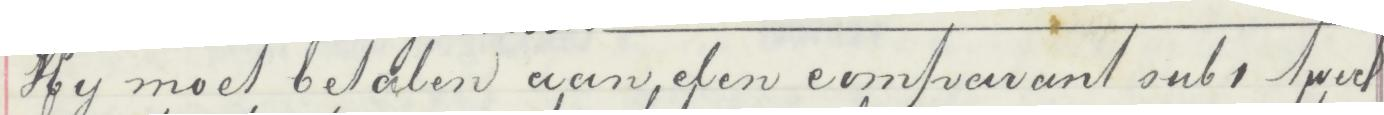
Hy moet betalen aan den comparant sub 1 twee
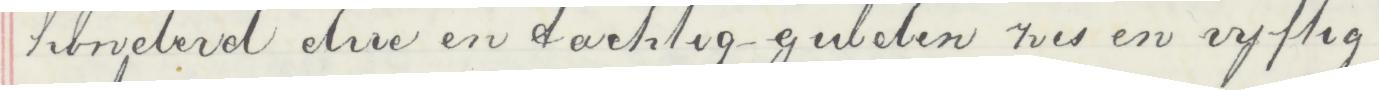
honderd drie en tachtig gulden zes en vyftig
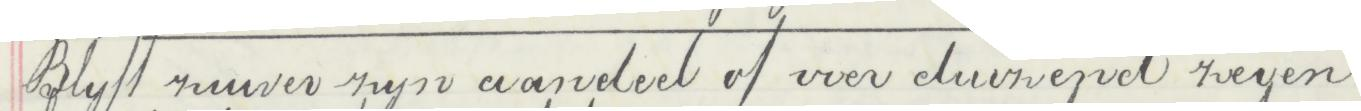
Blyft zuiver zyn aandeel of vier duizend zeven
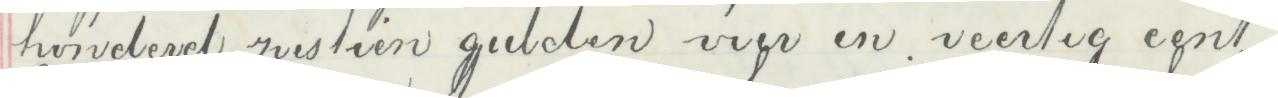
honderd zestien gulden vier en veertig cent
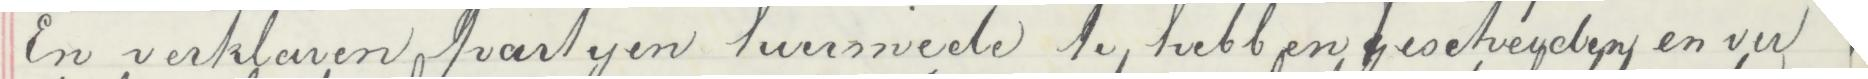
En verklaren, partyen hiermede te hebben gescheiden en ver
